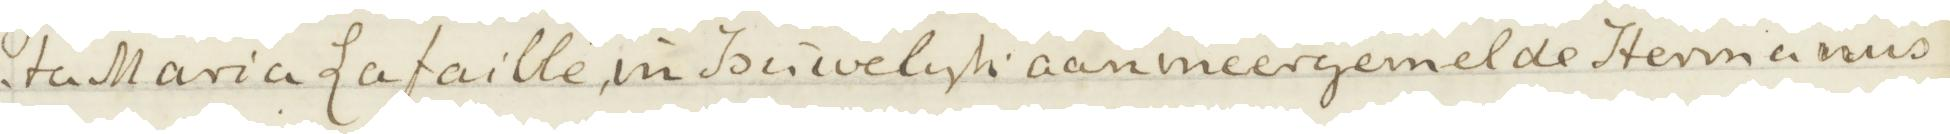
-ta Maria Lafaille in huwelyk aan meergemelde Hermanus
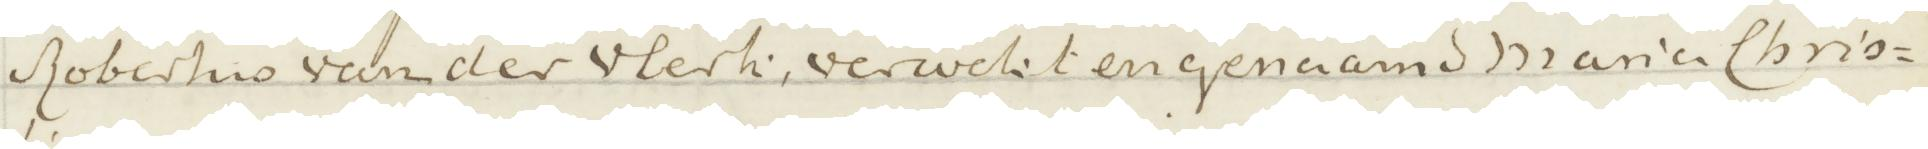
Robertus van der Vlerk, verwekt en genaamd Maria Chris=
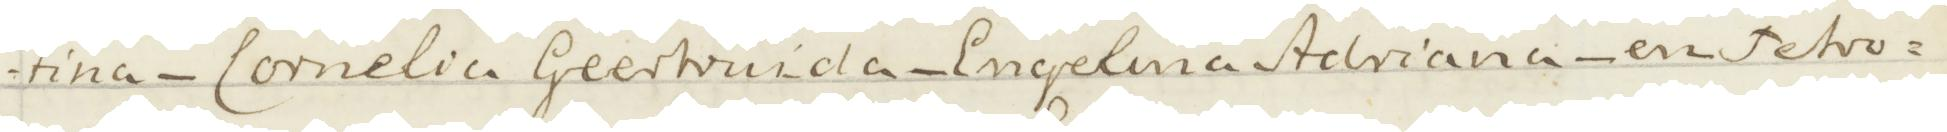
-tina - Cornelia Geertruida - Engelina Adriana - en Petro=
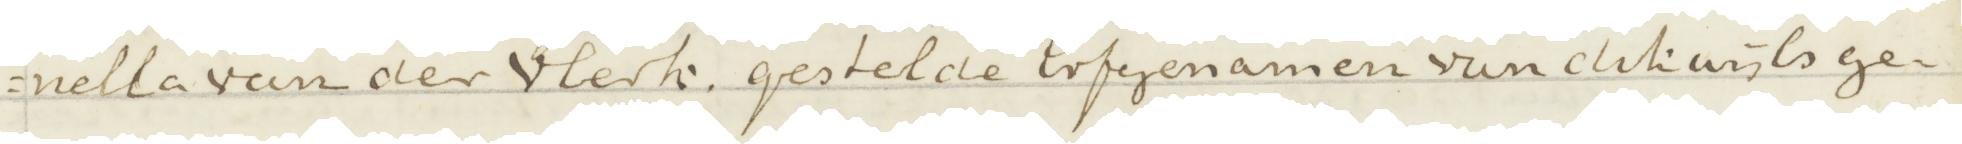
=nella van der Vlerk, gestelde Erfgenamen van dikwijls ge-
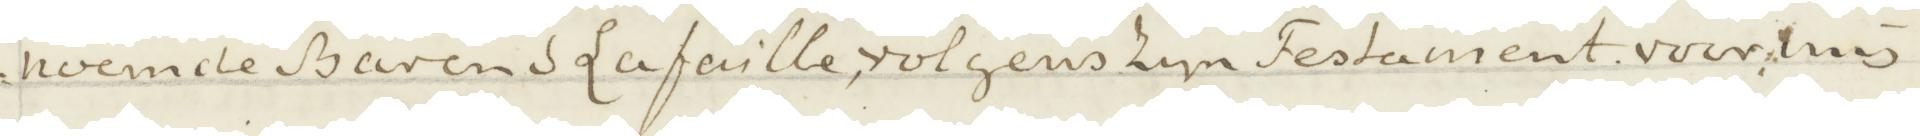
noemde Barend Lafaille, volgens Zyn Testament, voor mij
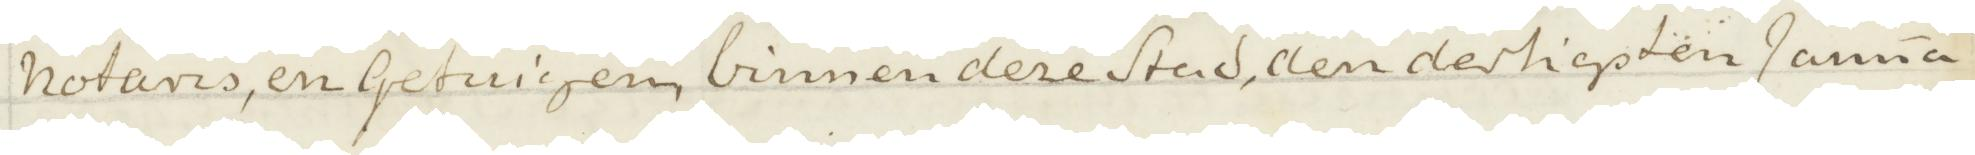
Notaris, en getuigen, binnen deze Stad, den dertigsten Janua
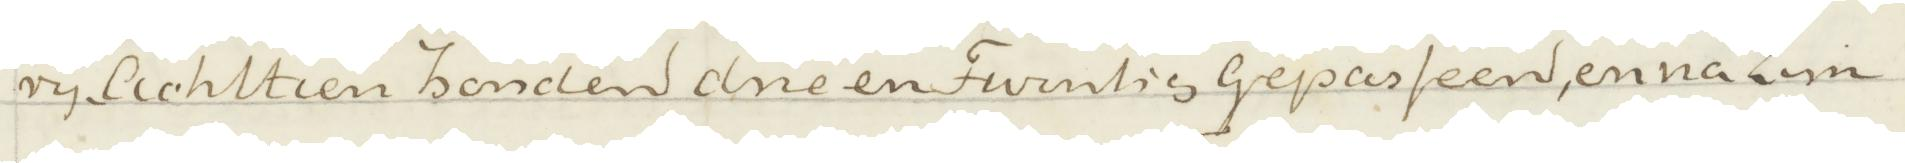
rij Achttien honderd drie en Twintig gepasseerd, en na Zyn
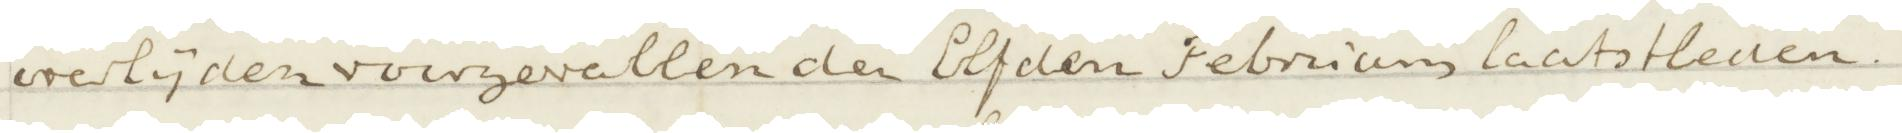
overlijden voorgevallen den Elfden Februarij laatstleden.
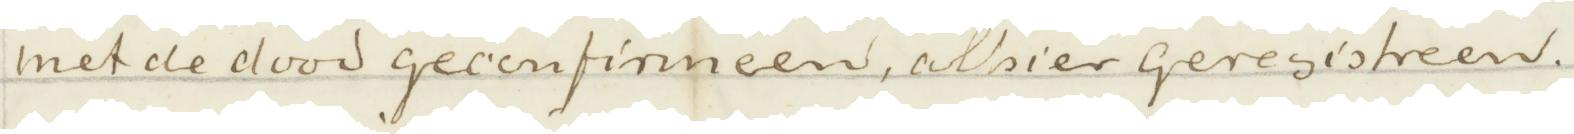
met de dood geconfirmeerd, alhier Geregistreerd.
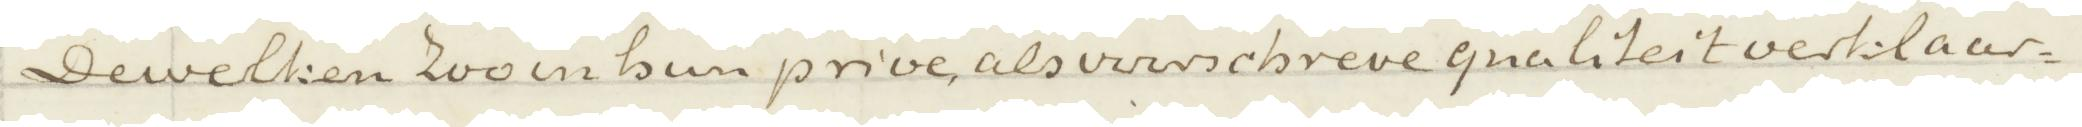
Dewelken Zoo in hun prive, als voorschreve qualiteit verklaar=
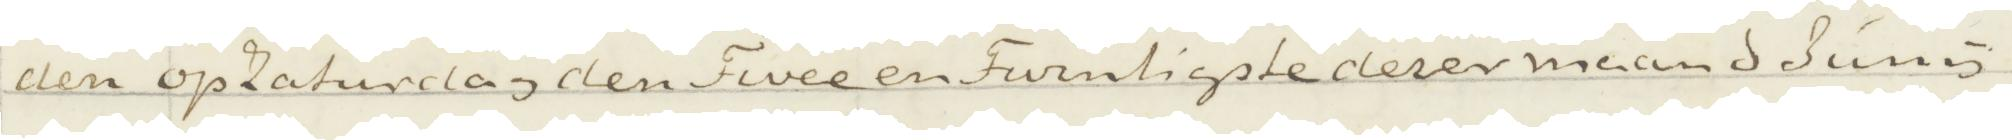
den op Zaturdag den twee en Twintigste deze maand Iunij
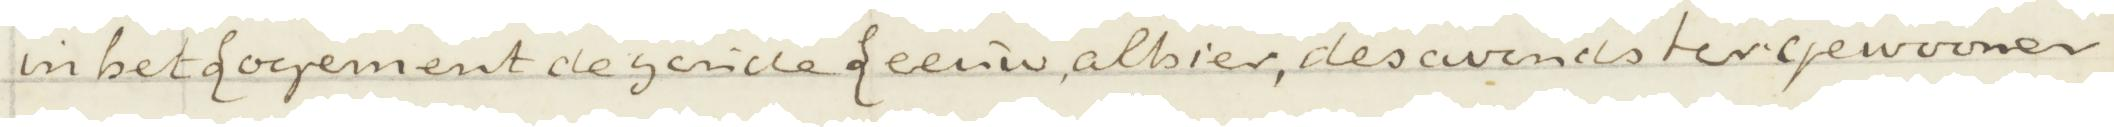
in het Logement de goude Leeuw alhier des avonds ter gewooner
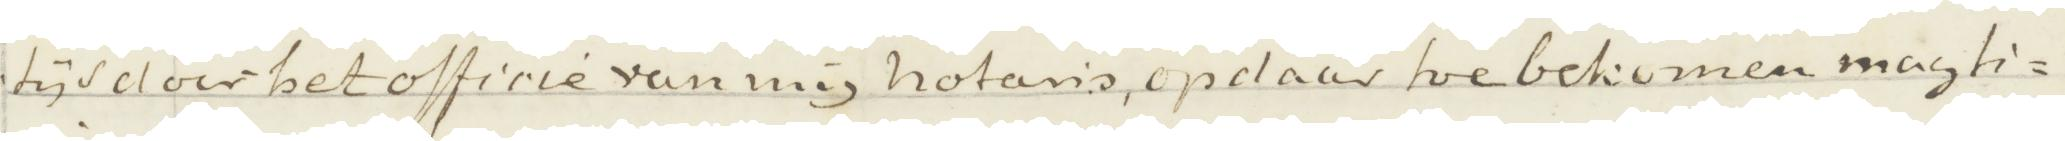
tijd door het officie van mij Notaris, op daar toe bekomen magti=
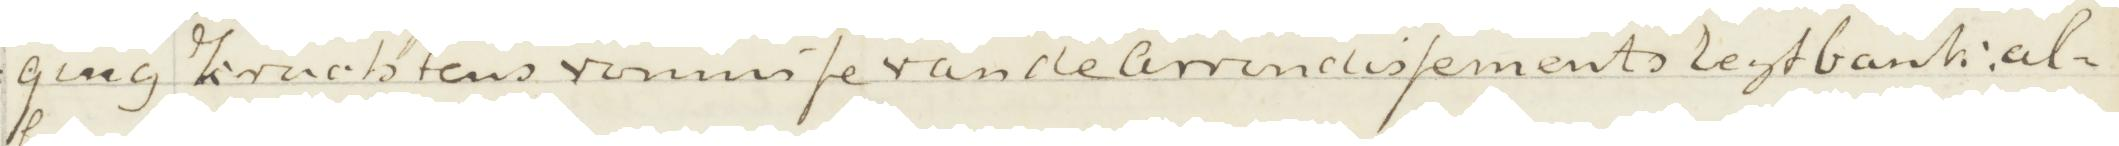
ging krachtens vonnisse van de Arrondissements regtbank: al„
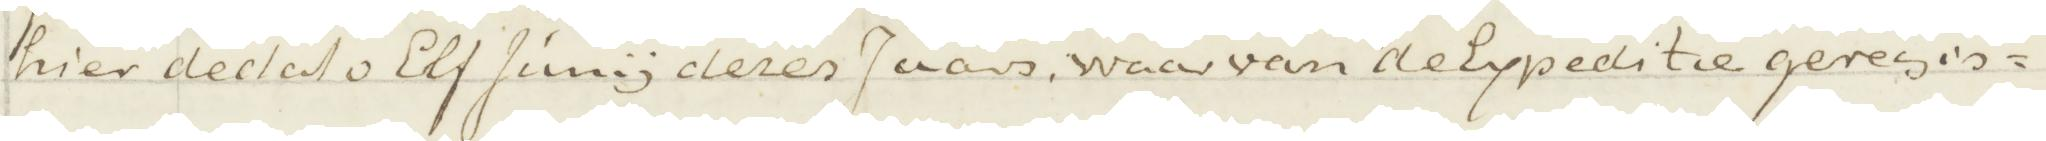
hier de dato Elf Junij dezes Jaars, waar van de Expeditie geregis=
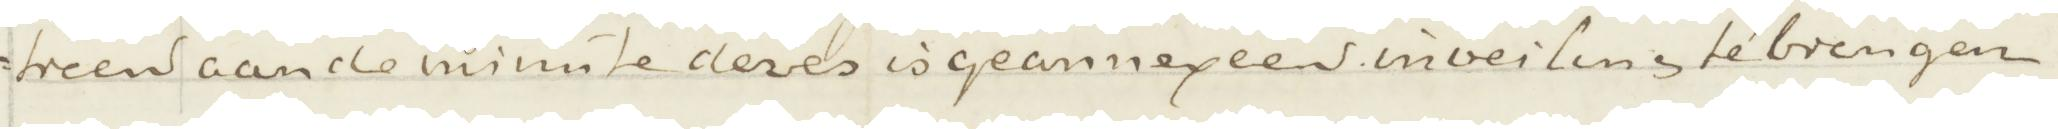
treerd aan de minute dezes is geannexeerd in veiling te brengen
